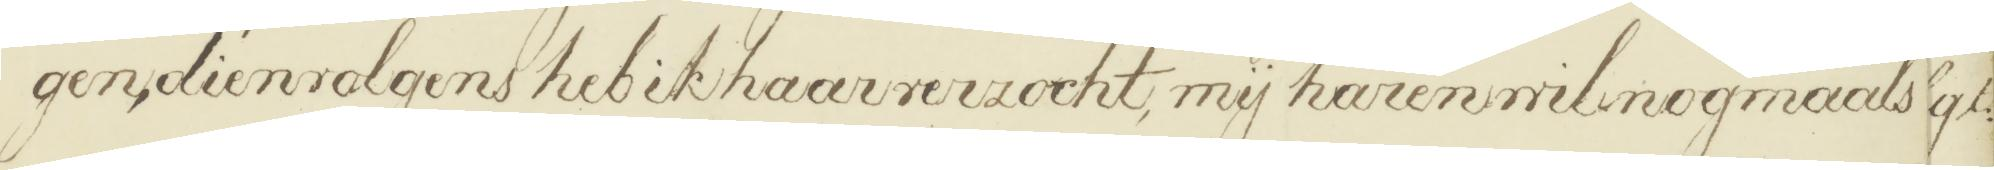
gen, dienvolgens heb ik haar verzocht, my haren wil nogmaals
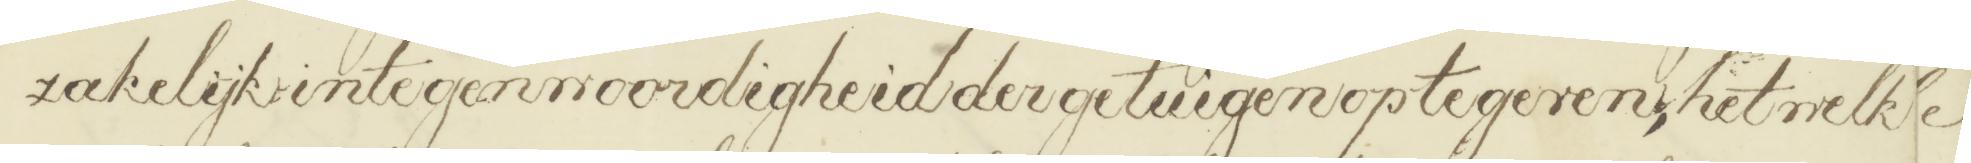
zakelijk integenwoordigheid der getuigen op te geven, het welk
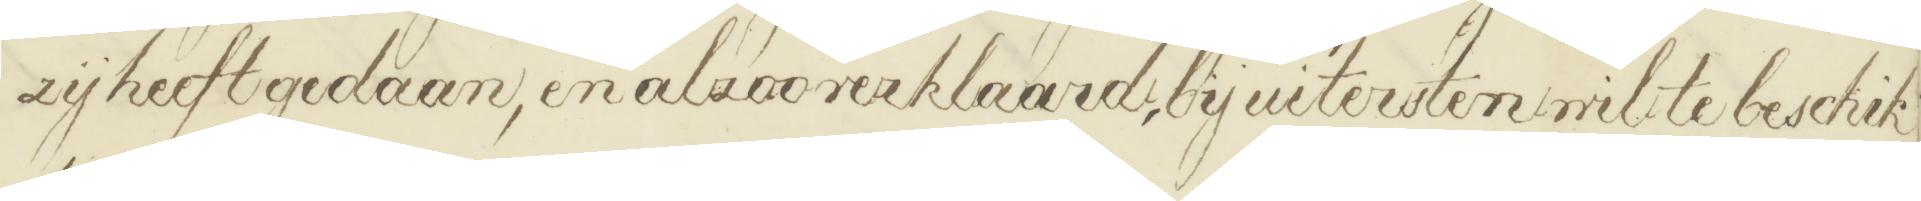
zij heeft gedaan, en alzoo verklaard, bij uitersten wil: te beschik
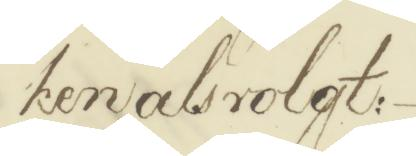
ken als volgt:
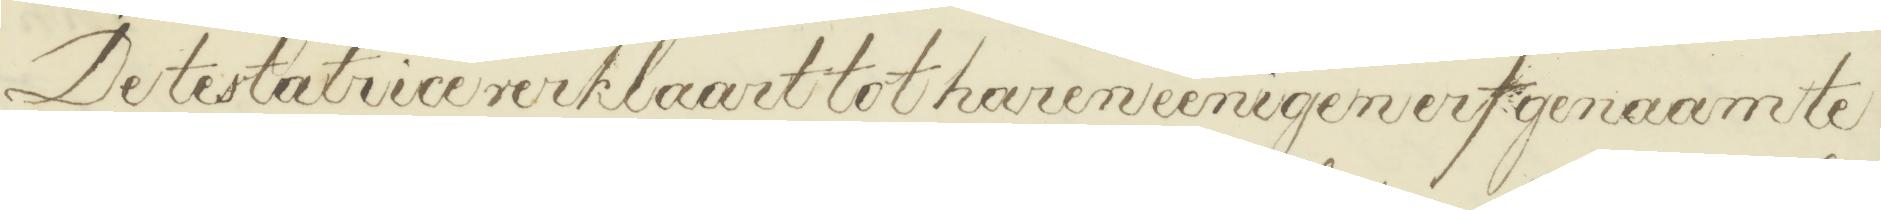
De testatrice verklaart tot haren eenigen erfgenaam te
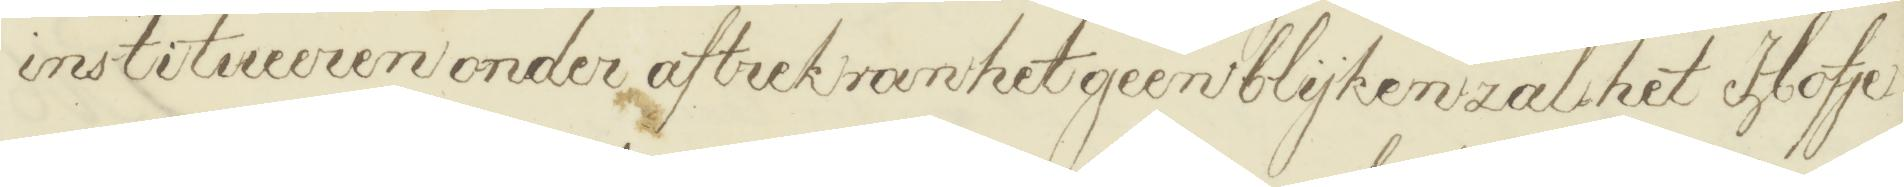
institueeren onder aftrek van het geen blijken zal het Hofje
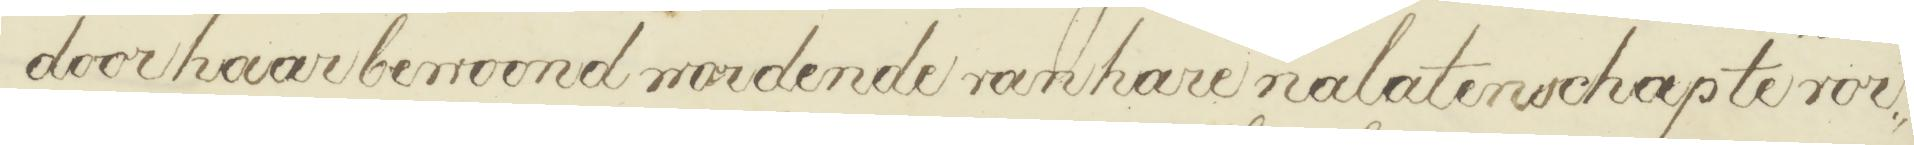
door haar bewoond wordende van hare nalatenschap te vor„
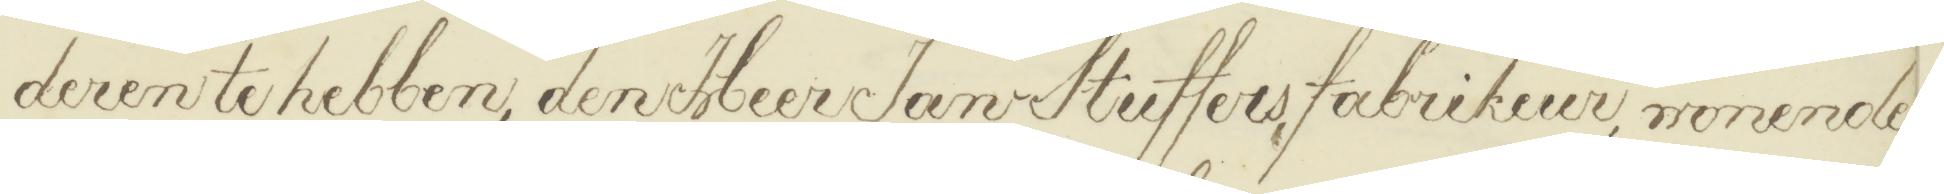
deren te hebben, den Heer Ian Huffers, fabrikeur, wonende
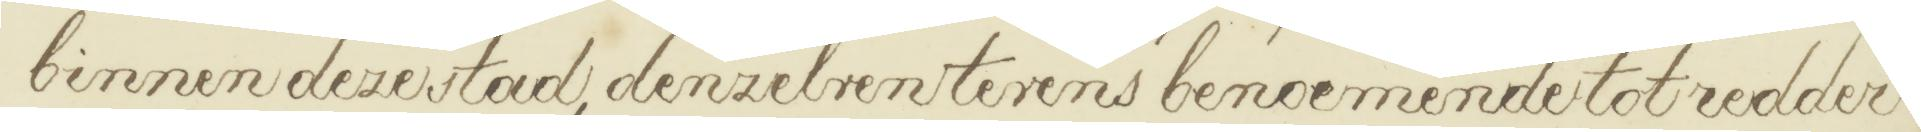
binnen deze stad, denzelven tevens benoemende tot redder
